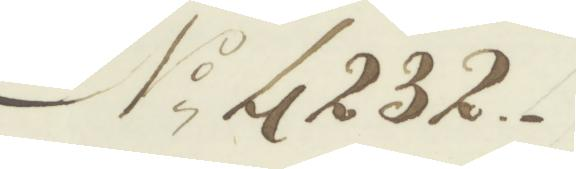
N„o 4232._
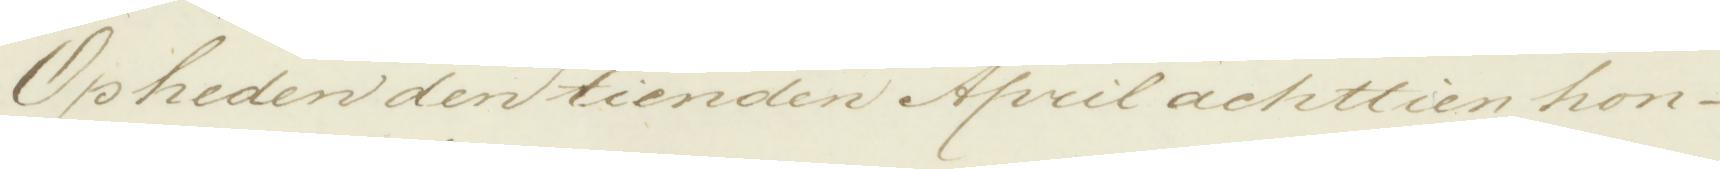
Opheden den tienden April achttien hon-
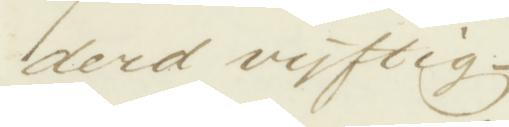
derd vijftig
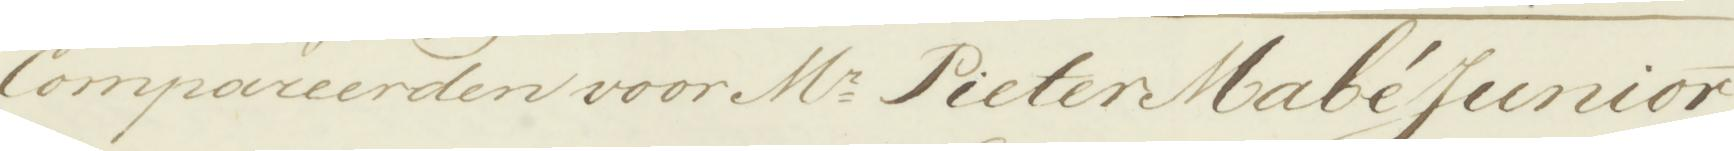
Compareerden voor M=r Pieter Mabé Junior
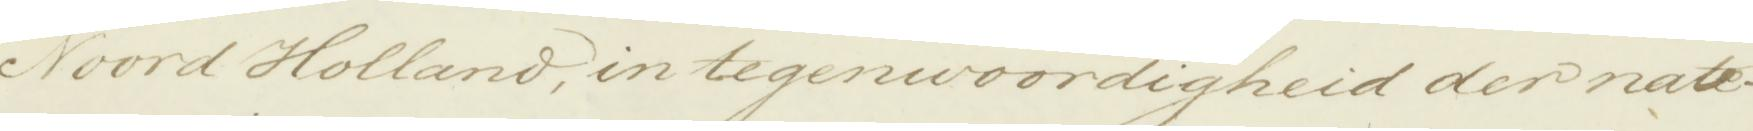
Noord Holland, in tegenwoordigheid der nate-
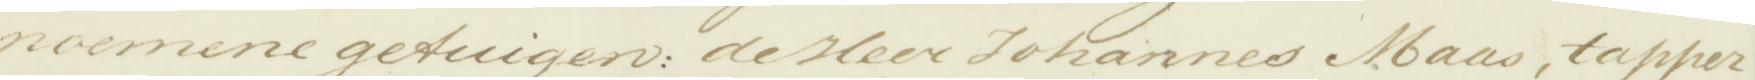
noemene getuigen: de Heer Johannes Maas, tapper
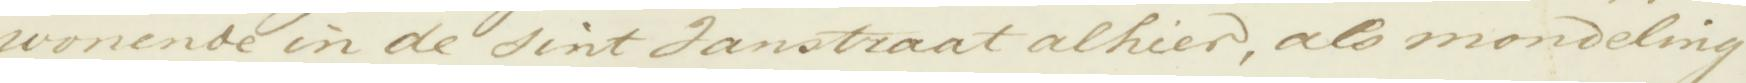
wonende in de sint Janstraat alhier, als mondeling
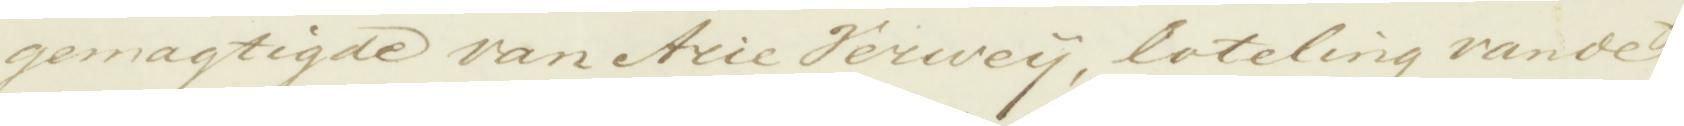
gemagtigde van Arie Verweij, loteling van de
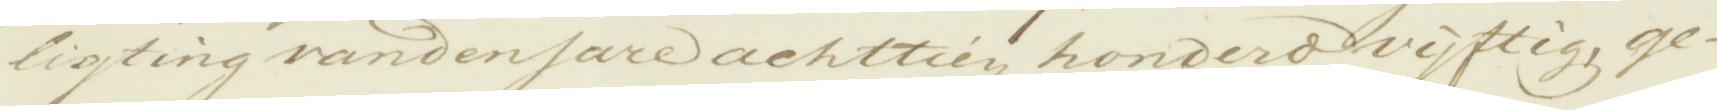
ligting van den jare achttien honderd vijftig, ge-
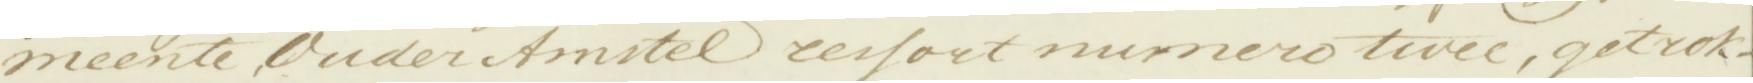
meente Ouder Amstel ressort numero twee, getrok-
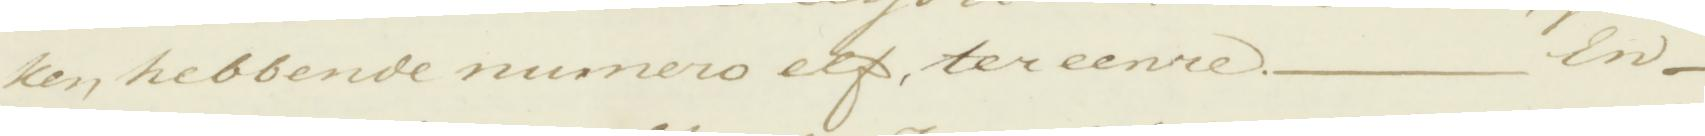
ken hebbende numero elf, ter eenre._ En _
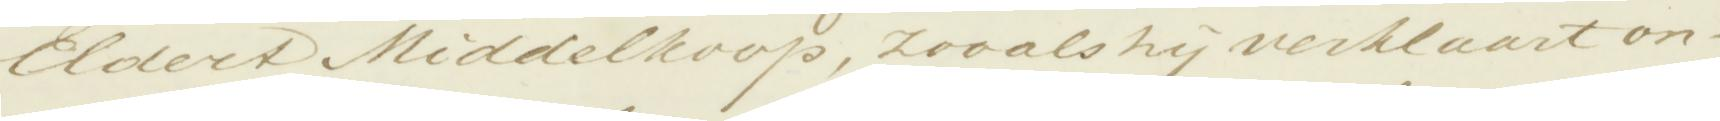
Eldert Middelkoop, zooals hij verklaart on-
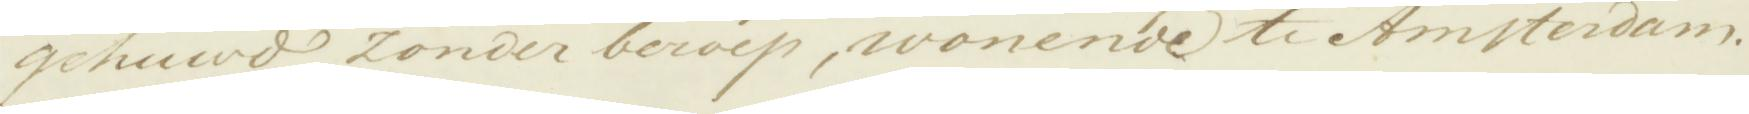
gehuwd, zonder beroep, wonende te Amsterdam.
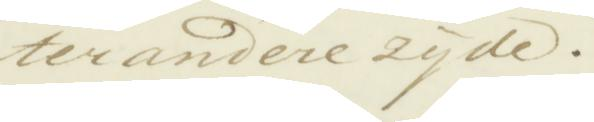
ter andere zijde.
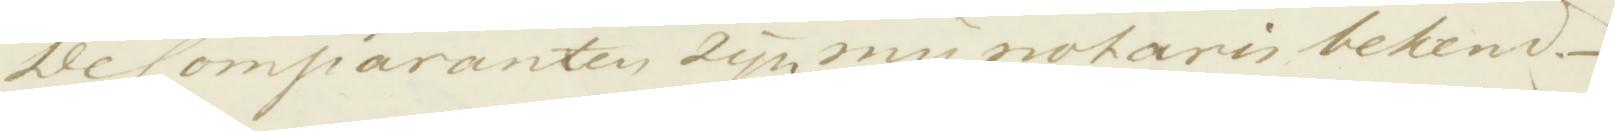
De Comparanten zijn mij notaris bekend._
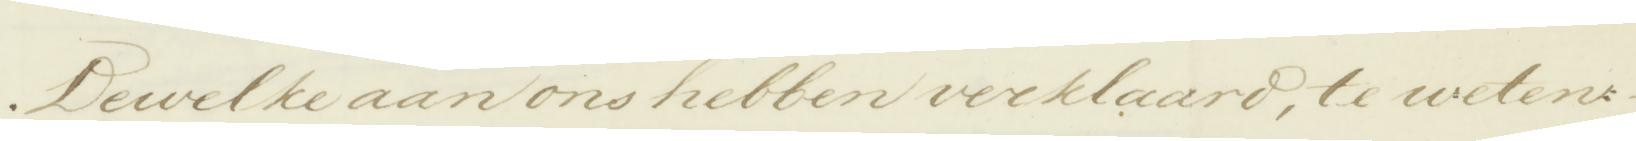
Dewelke aan ons hebben verklaard, te weten
